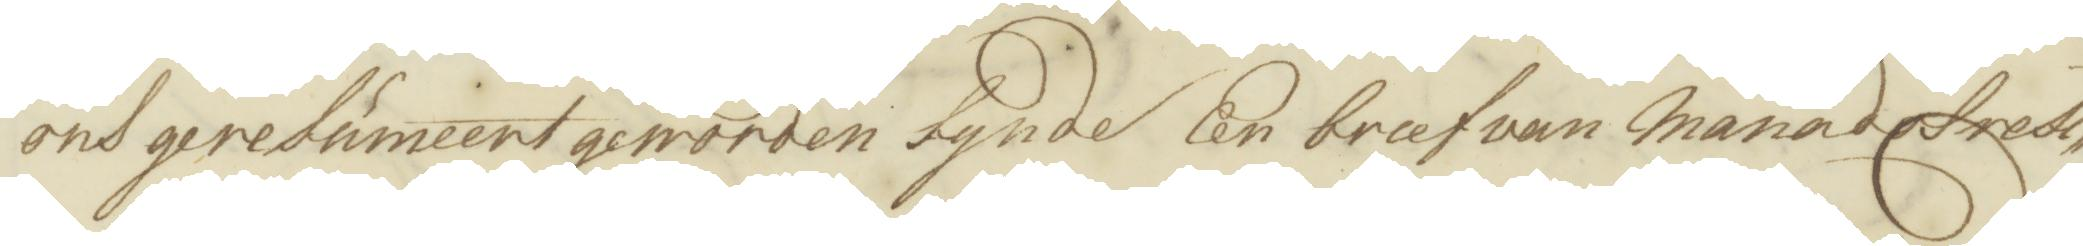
ons geresumeert geworden synde Een brief van manados resi
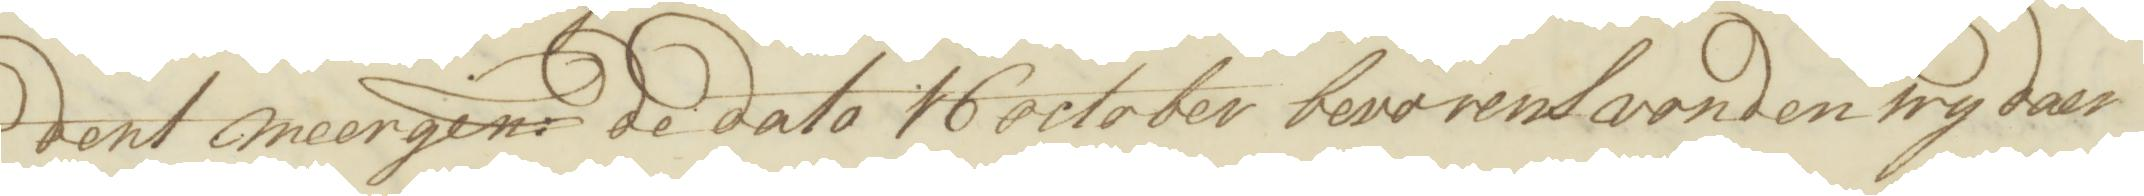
dent meergen: de dato 16 october bevorens vonden wy daer
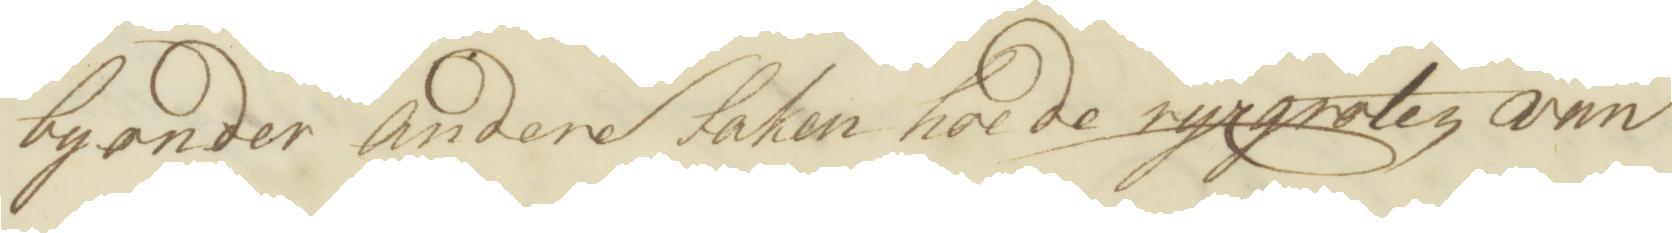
by onder andere saken hoede ryxgroten van
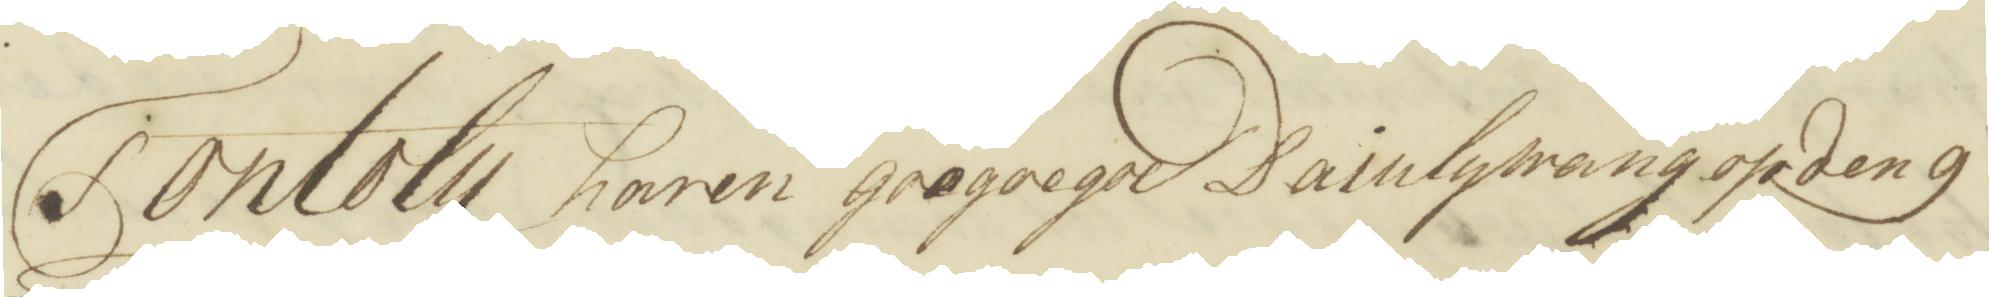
Tontoly haren goegoegoe Dainlywang op den 9
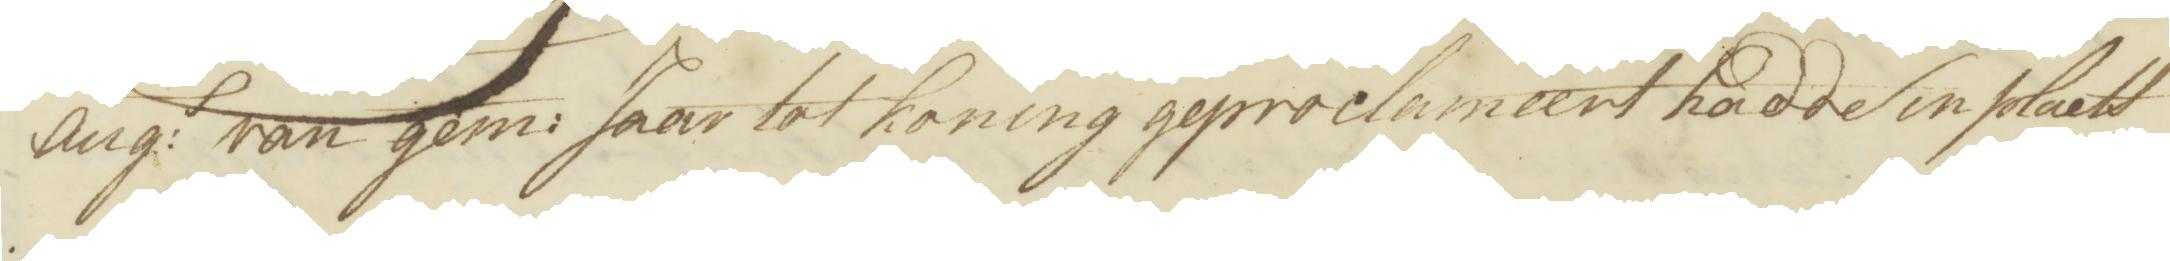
aug:s van gem: Jaar tot koning geproclameert hadde in plaets
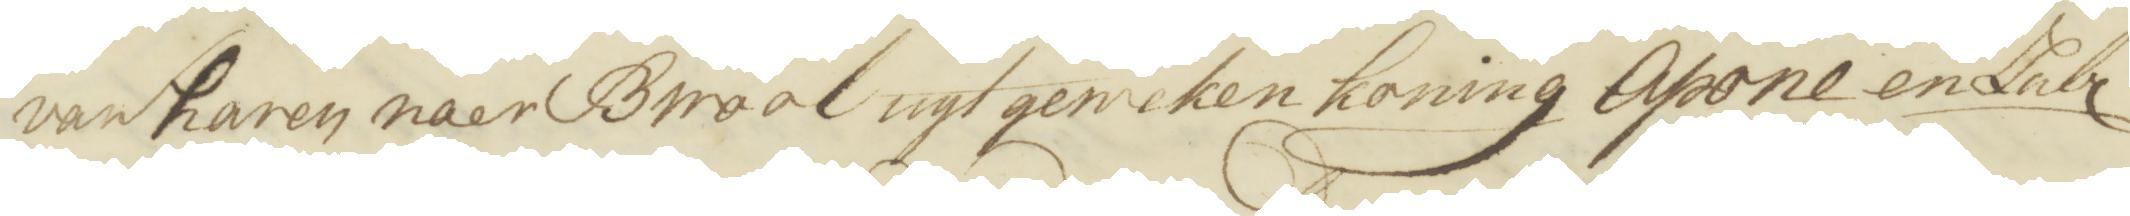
van haren naer Bwool uytgeweken koning Apone en zulx
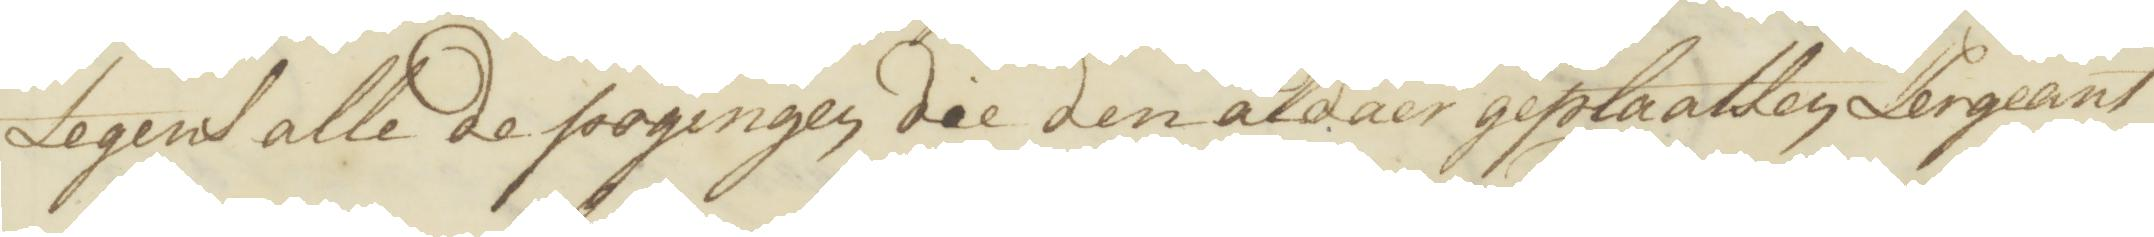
tegens alle de pogingen die den aldaer geplaatsen zergeant
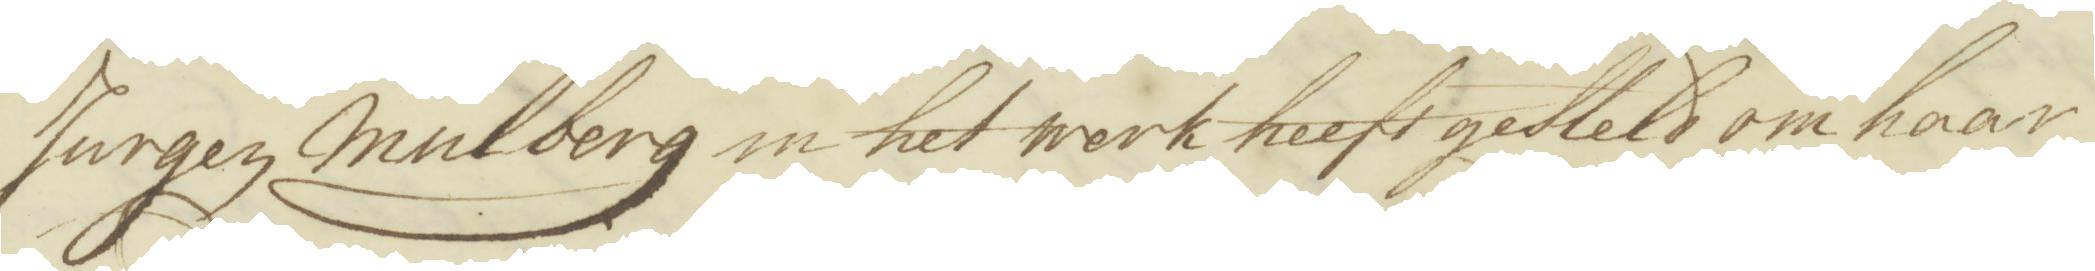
Jurgen mulberg in het werk heeft gesteld om haar
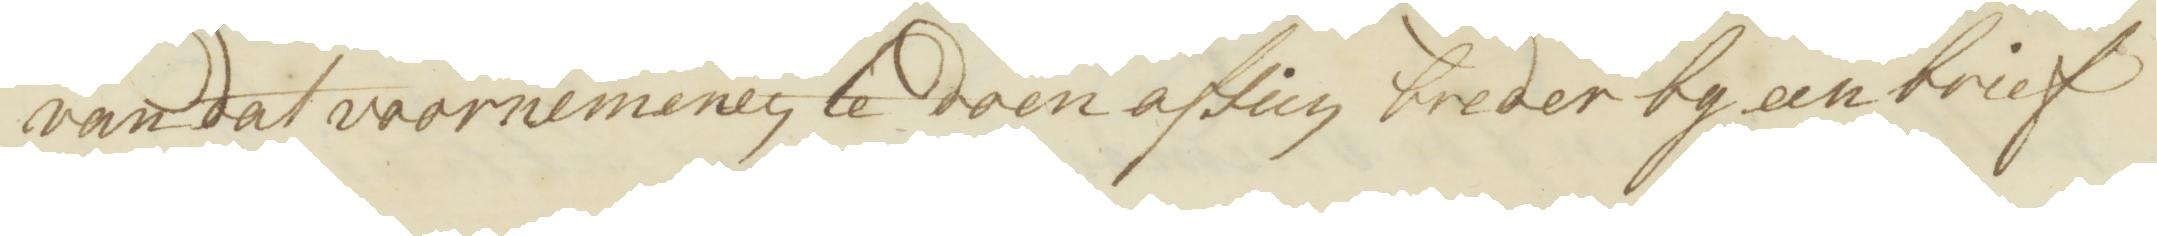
van dat voornemenen te doen afsien breder by een brief
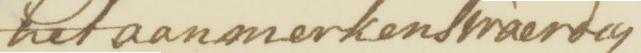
het aanmerkens waerdig
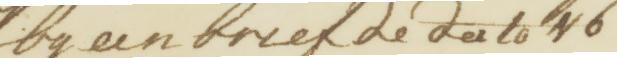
by een brief de dato 16
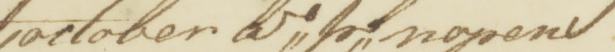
october a„o p„o nopens
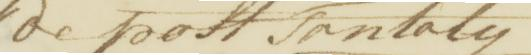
de post Tontoly
